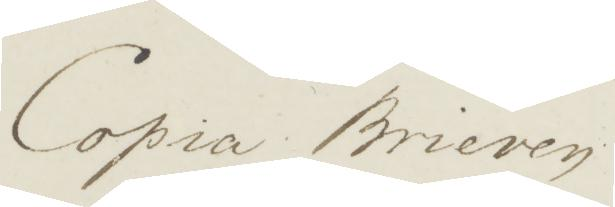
Copia Brieven - - - - - - - - - - - - - - L=a A:
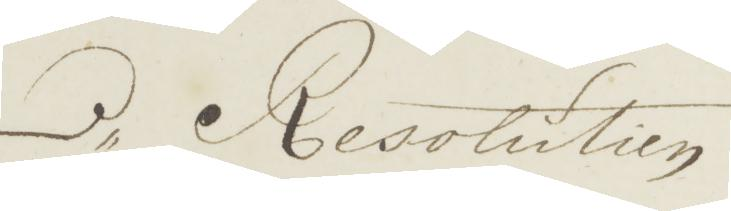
_„o Resolutien - - - - - - - - - - - „ B:
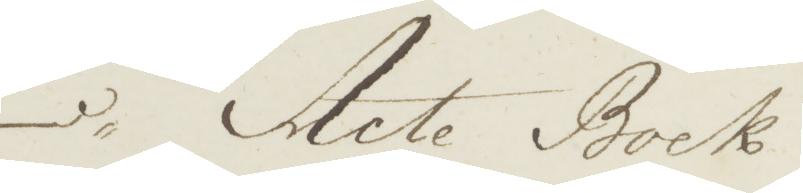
_„o Acte Boek - - . . - - - - - - - - „ C:
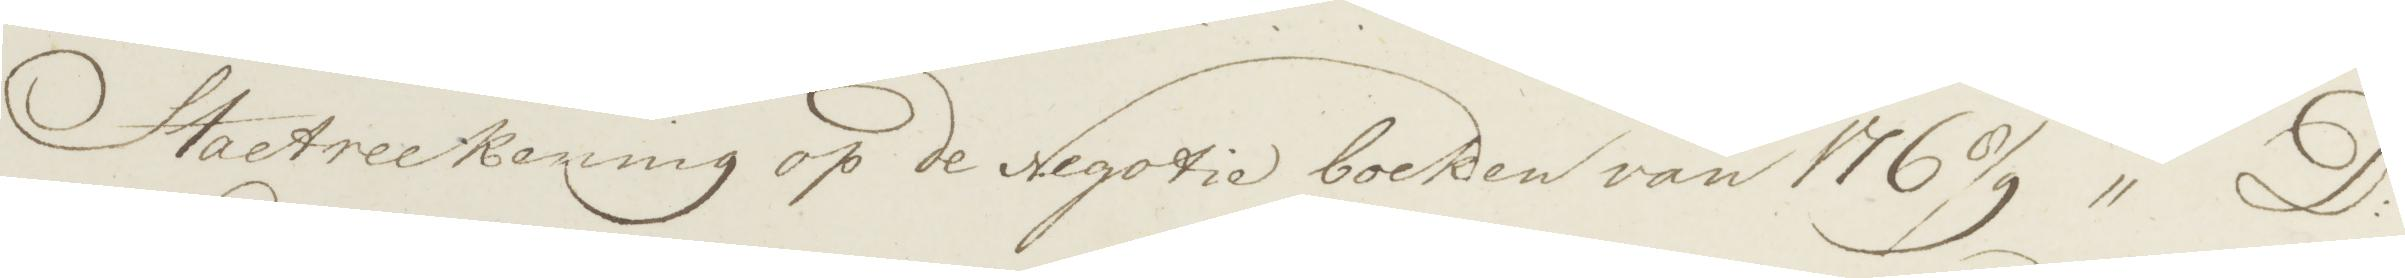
Staetreekening op de Negotie boeken van 176 8/9 „ D:
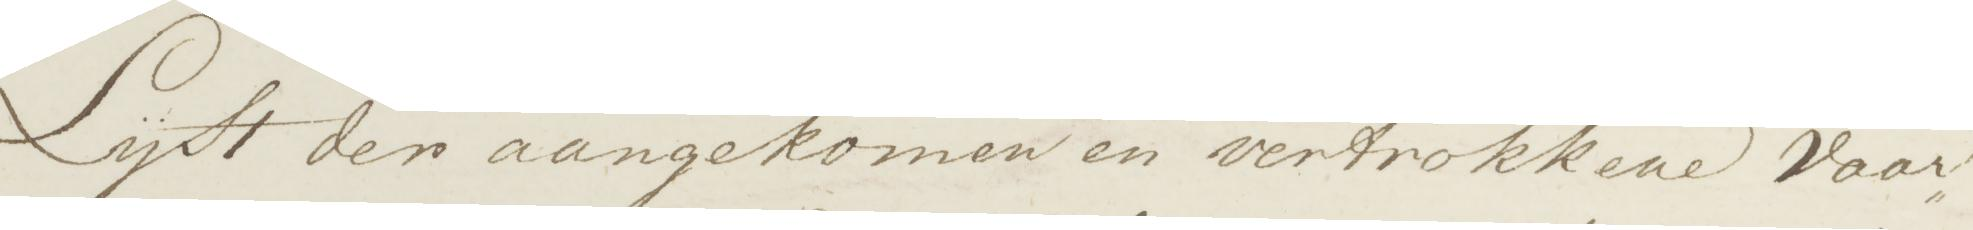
Lijst der aangekomen en vertrokkene vaar„
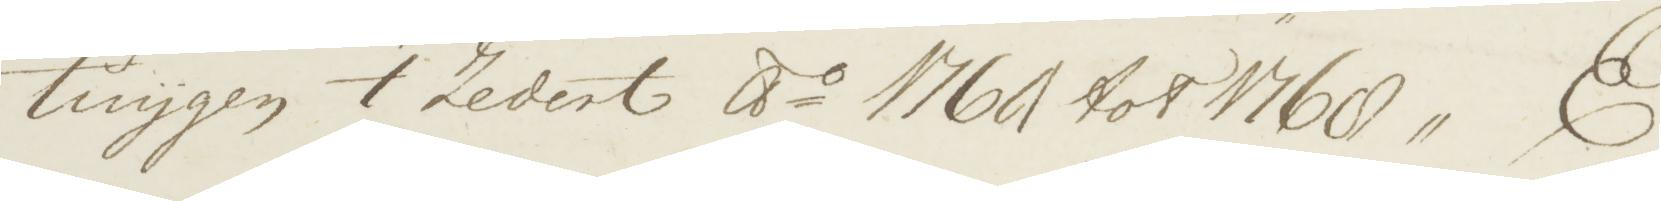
tuijgen ’t zedert A=o 1764 tot 1768 „ E:
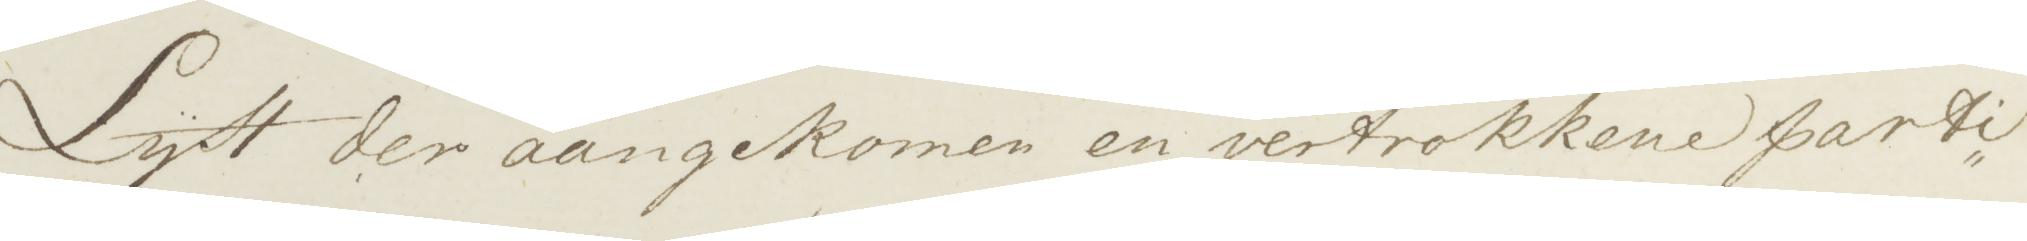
Lijst der aangekomen en vertrokkene parti„
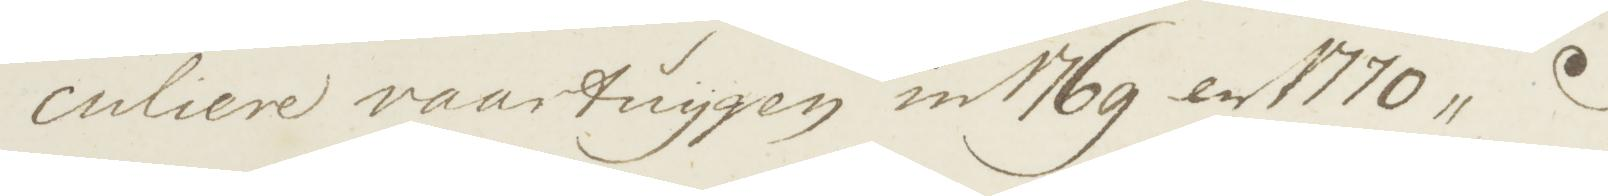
culiere vaartuijgen in 1769 en 1770 „ F:
